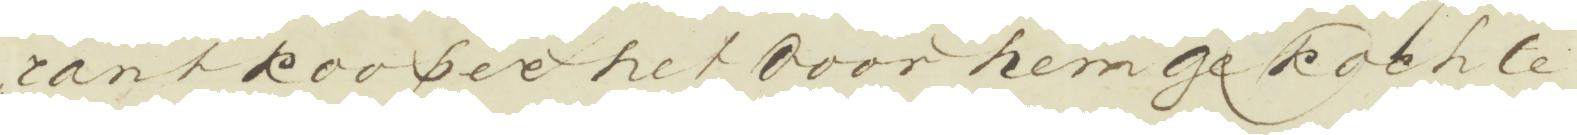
„rant kooper het door hem gekochte
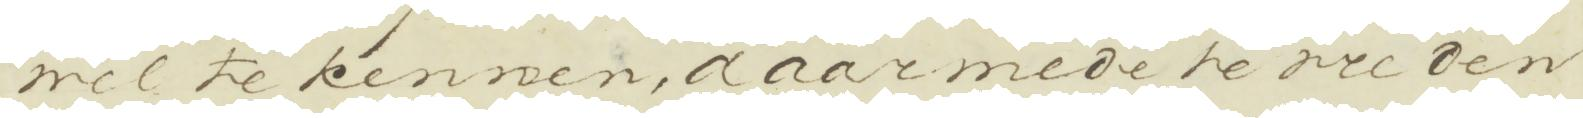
wel te kennen, daar mede te vreden
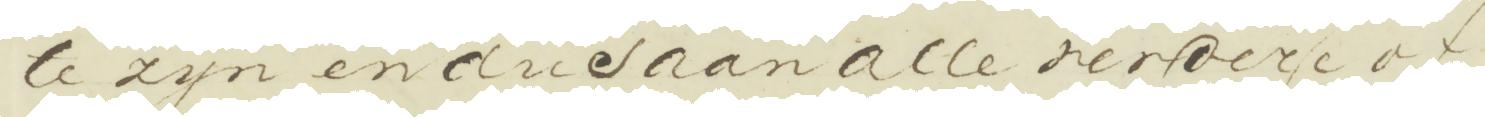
te zyn en dus aan alle verdere of
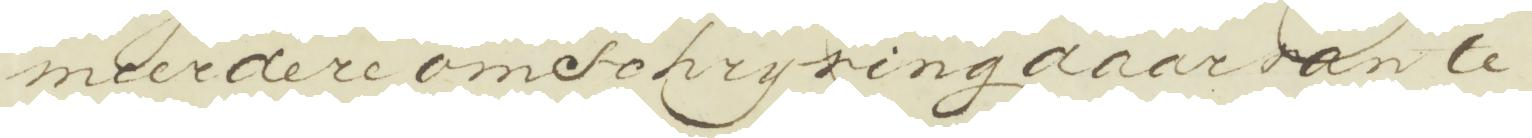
meerdere omschryving daar van te
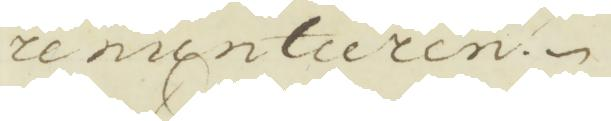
renuntieren.
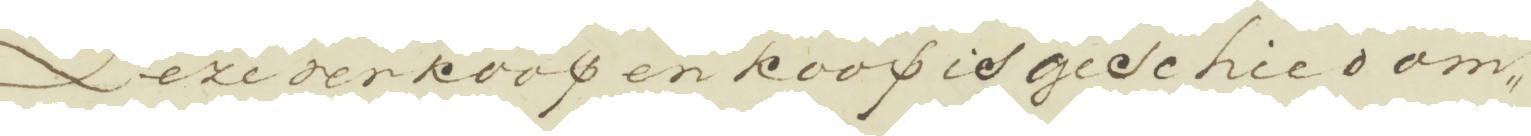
Deze verkoop en koop is geschied om„
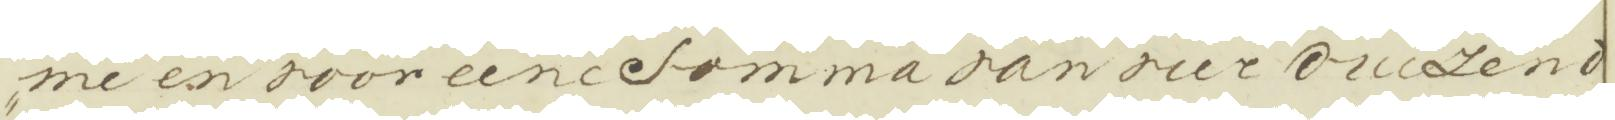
„me en voor eene Somma van vier duizend
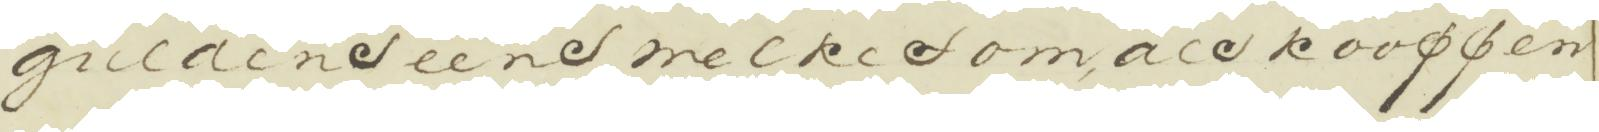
guldens eens, welke Som, als kooppen
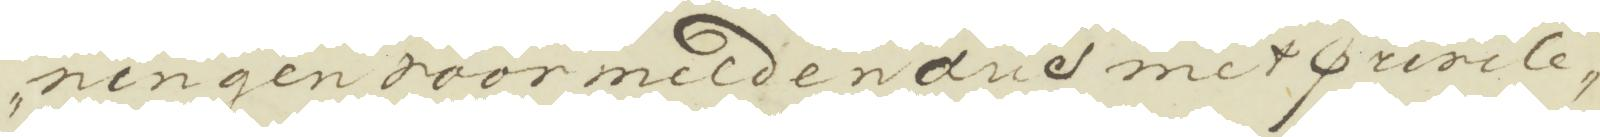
„ningen voor melden dus met privile„
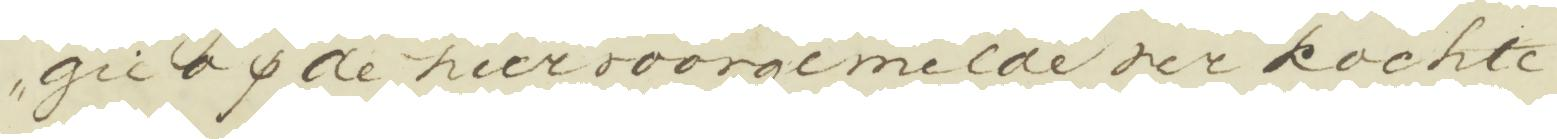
„gie op de hier voorgemelde verkochte
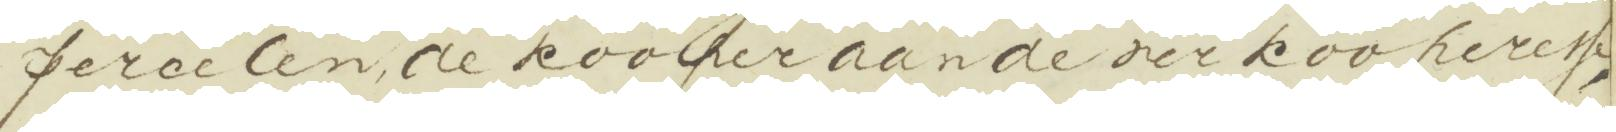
percelen, de kooper aan de verkooperesse,
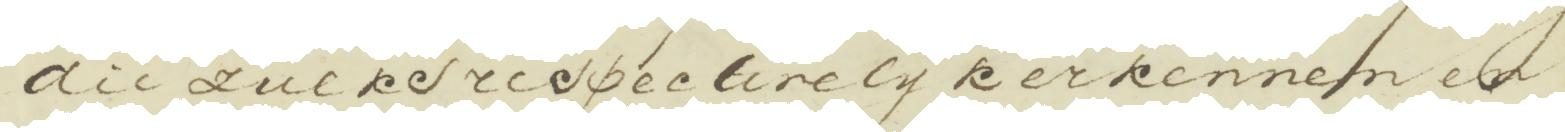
die zulks respectivelyk erkennen en
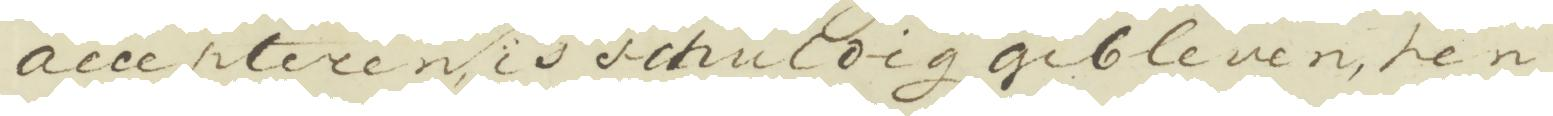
accepteren, is schuldig gebleven, ten
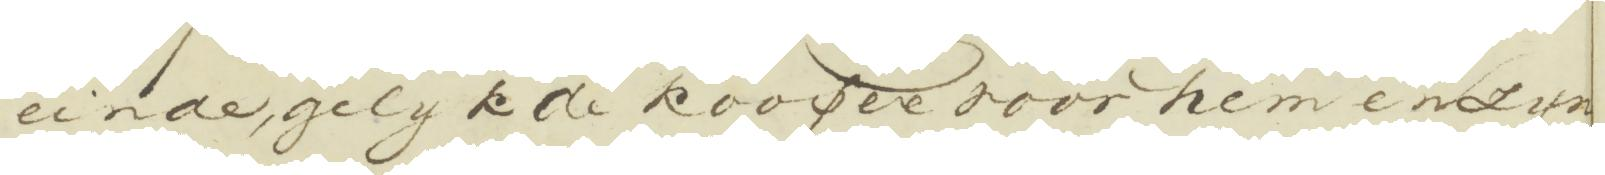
einde, gelyk de kooper voor hem en zyn
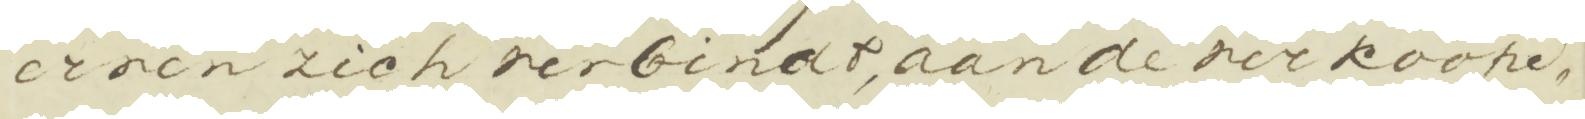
erven zich verbindt, aan de verkoope,
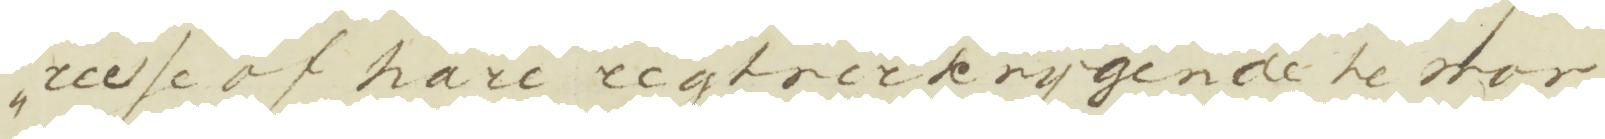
„resse of hare regt verkrygende te wor
